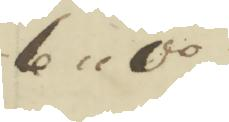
6 „ do
